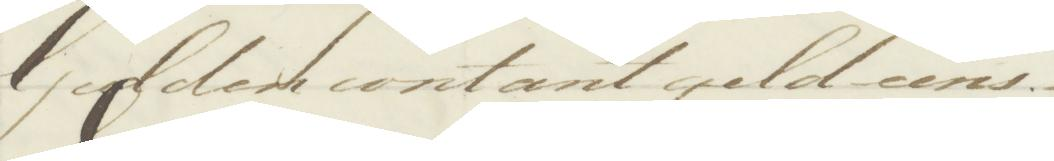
Gulden contant geld eens.
